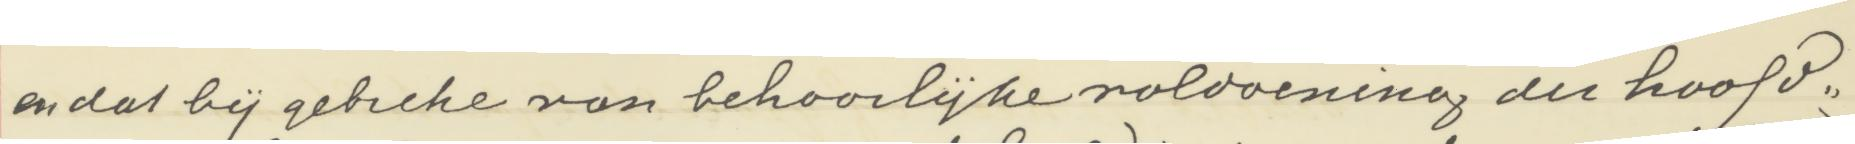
en dat bij gebreke van behoorlijke voldoening der hoofd„
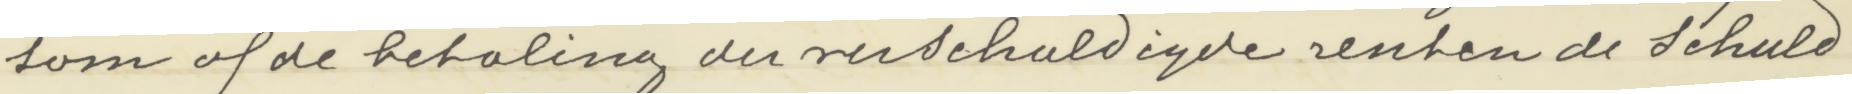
som of de betaling der verschuldigde renten de schuld
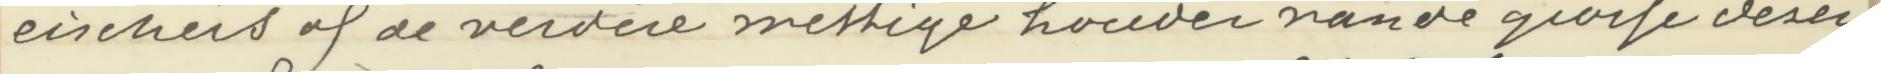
eischers of de verdere wettige houder van de grosse dezer
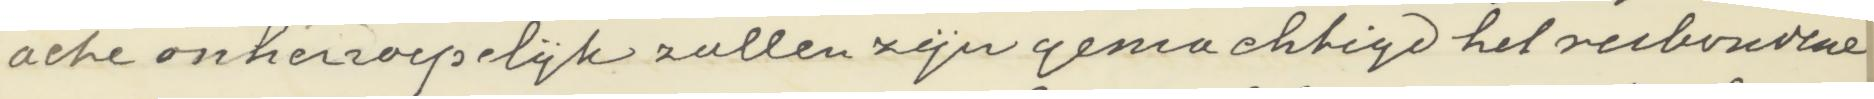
acte onherroepelijk zullen zijn gemachtigd het verbondene
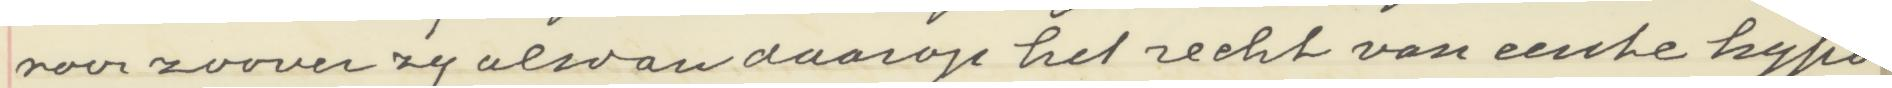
voor zoover zy alsvan daarop het recht van eerste hypo
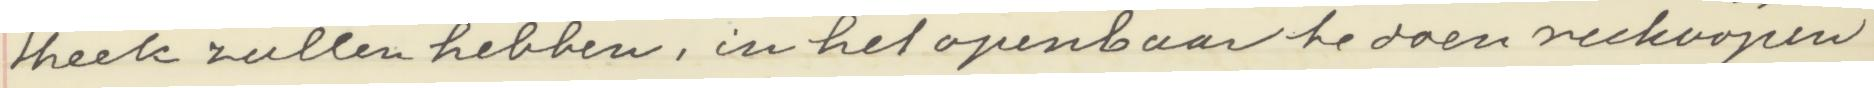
theek zullen hebben, in het openbaar te doen verkoopen
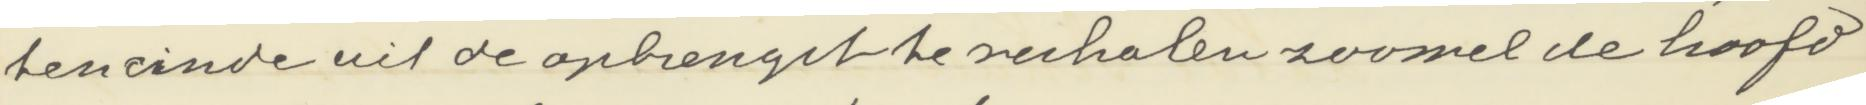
ten einde uit de opbrengst te verhalen zoowel de hoofd
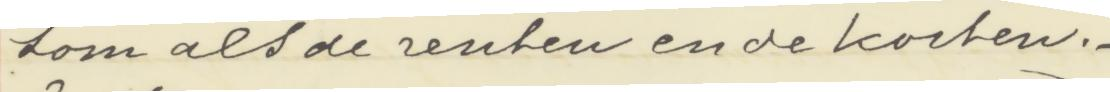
som als de renten en de kosten.
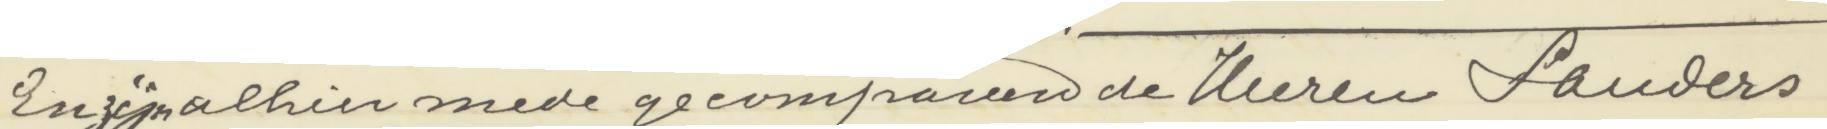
Enzijn alhier mede gecompareerd de Heeren Sanders
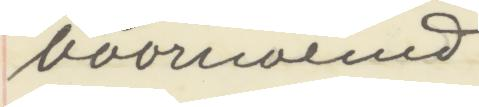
voornoemd
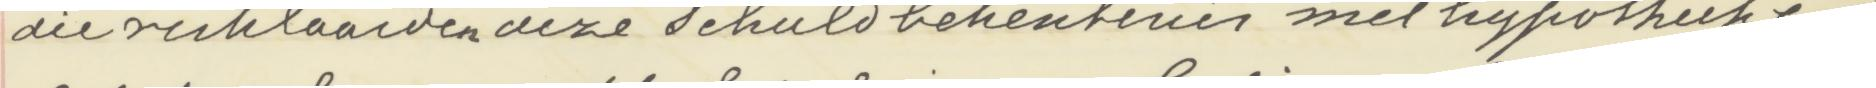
die verklaarden deze schuldbekentenis met hypotheek en
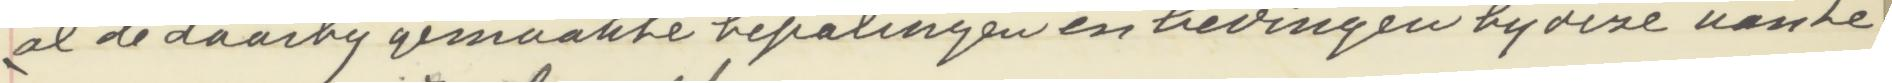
al de daarby gemaakte bepalingen en bedingen by deze aan te
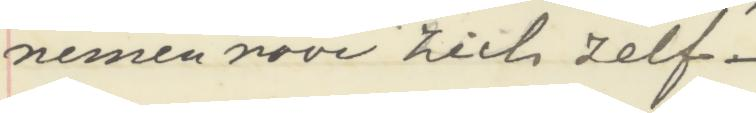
nemen voor zich zelf -
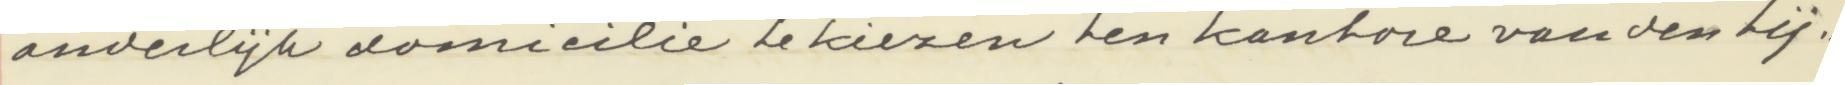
anderlijk domicilie te kiezen ten kantore van den tij„
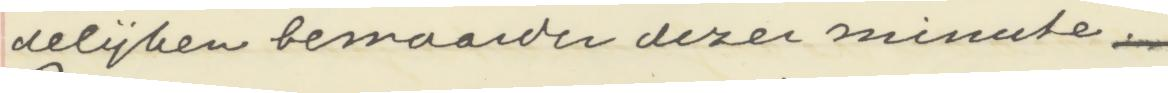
delijken bewaarder dezer minute -
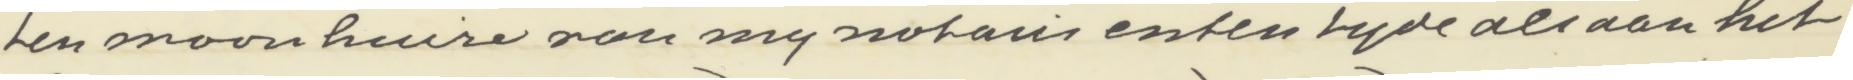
ten woonhuize van my notaris en ten tyde als aan het
